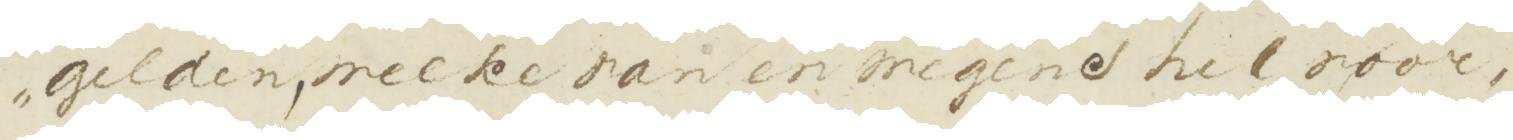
„gelden, welke van en wegens het voor,
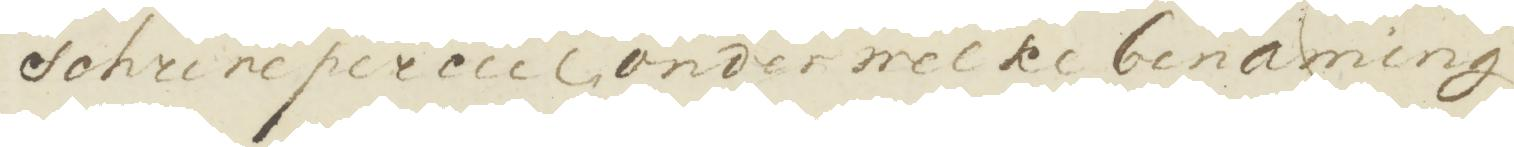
schreve perceel, onder welke benaming
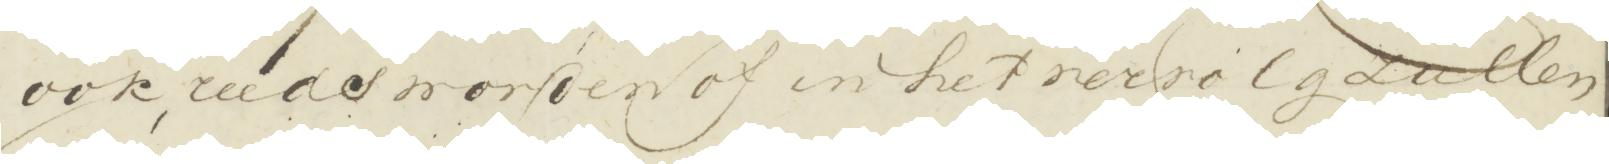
ook, reeds worden of in het vervolg zullen
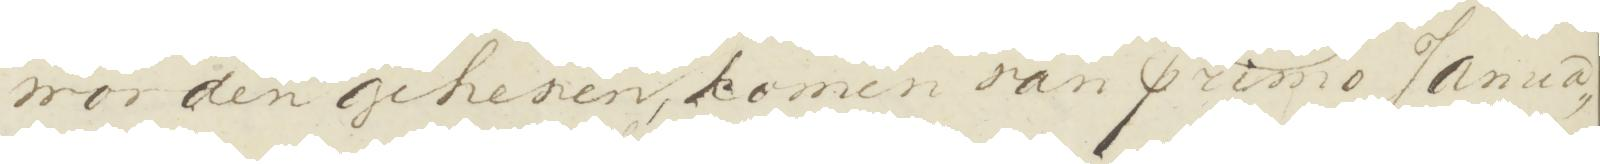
worden geheven, komen van Primo Janua„
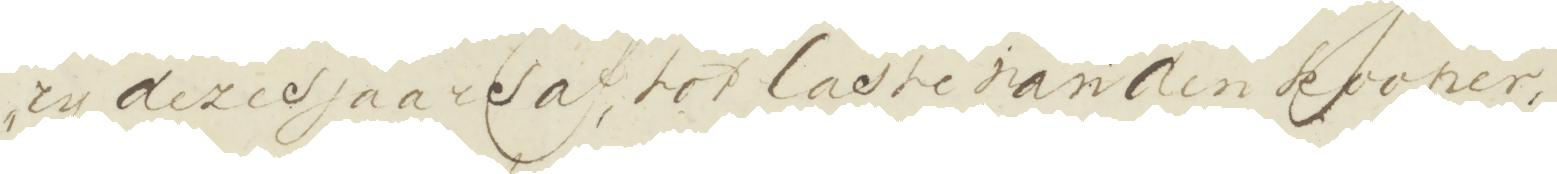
„ry dezes jaars af, tot laste van den kooper,
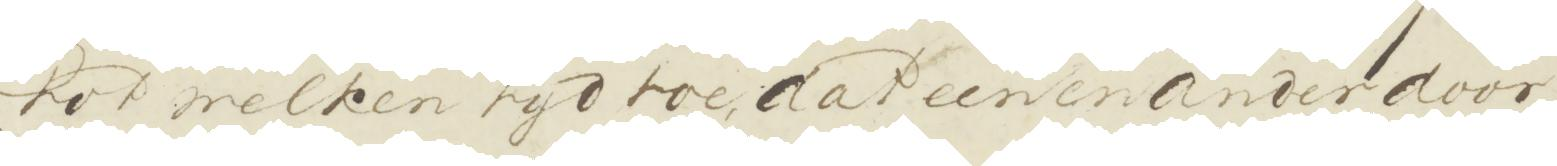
tot welken tyd toe, dat een en ander door
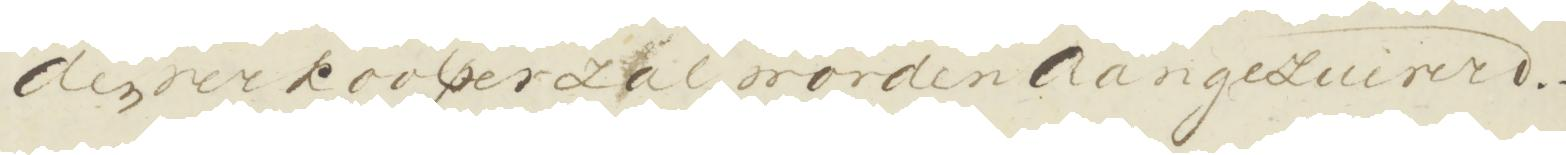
den verkooper zal worden aangezuiverd.
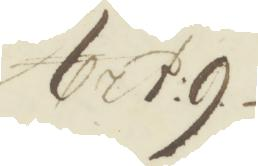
Art: 19.
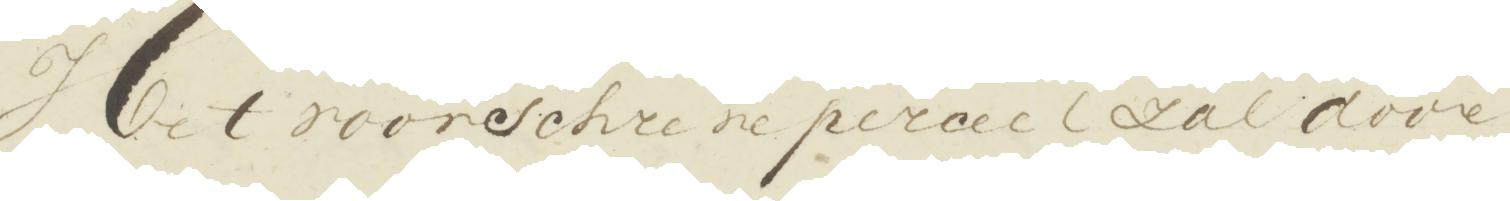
Het voorschreve perceel zal door
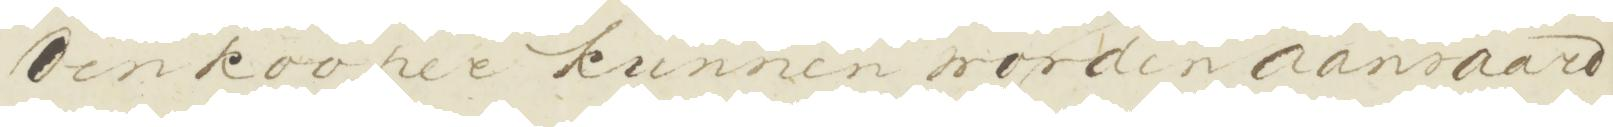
den kooper kunnen worden aanvaard
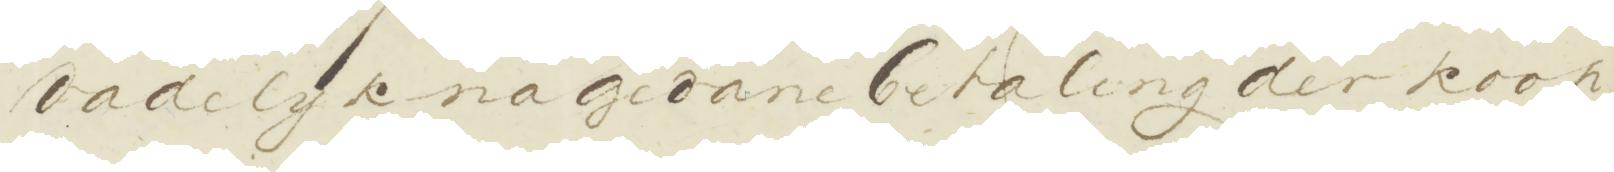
dadelyk na gedane betaling der koop
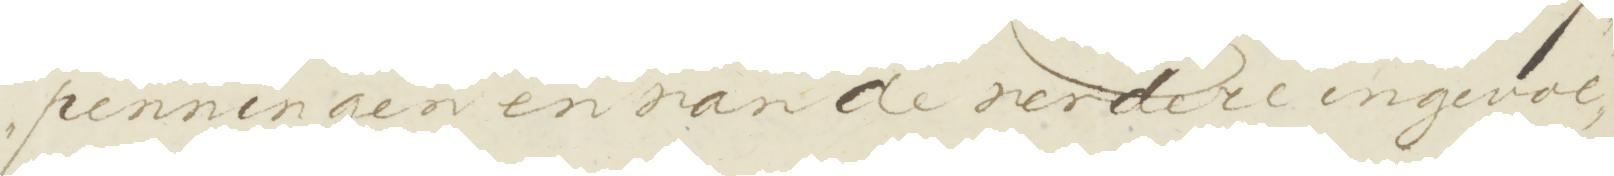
„penningen en van de verdere ingevol„
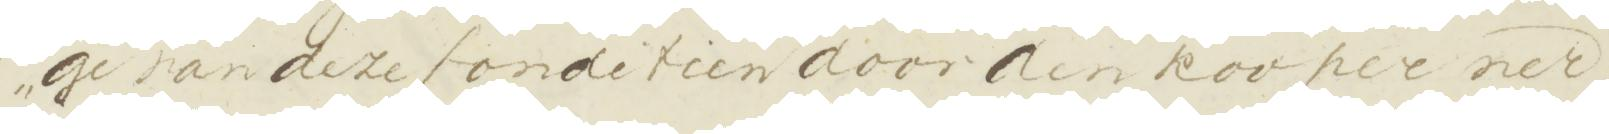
„ge van deze Conditien door den kooper ver
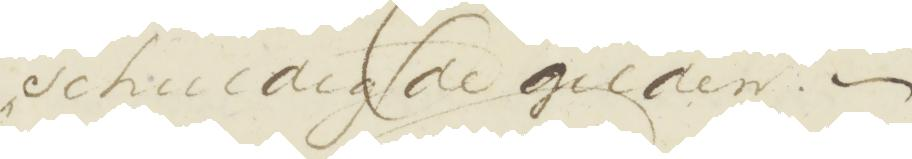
„schuldigde gelden.
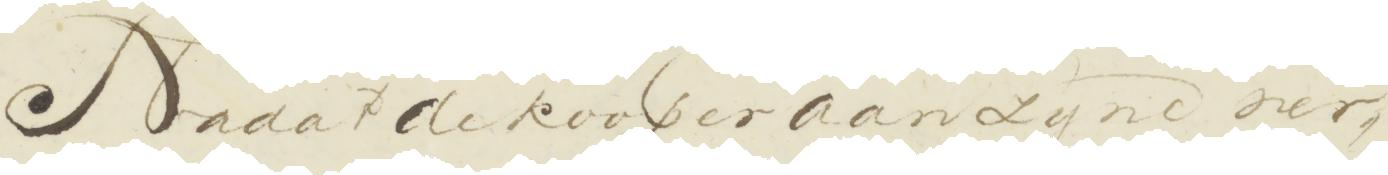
Nadat de kooper aan zyne ver„
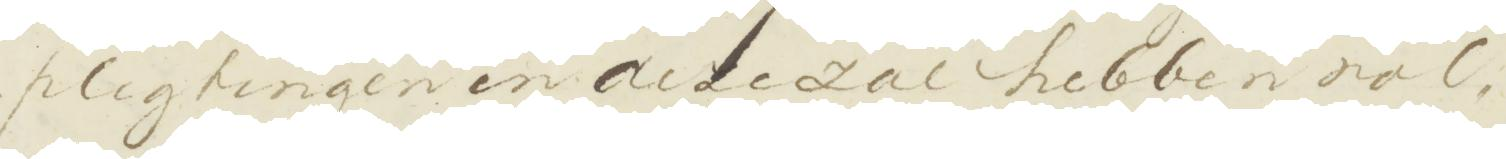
„pligtingen en deze zal hebben vol„
